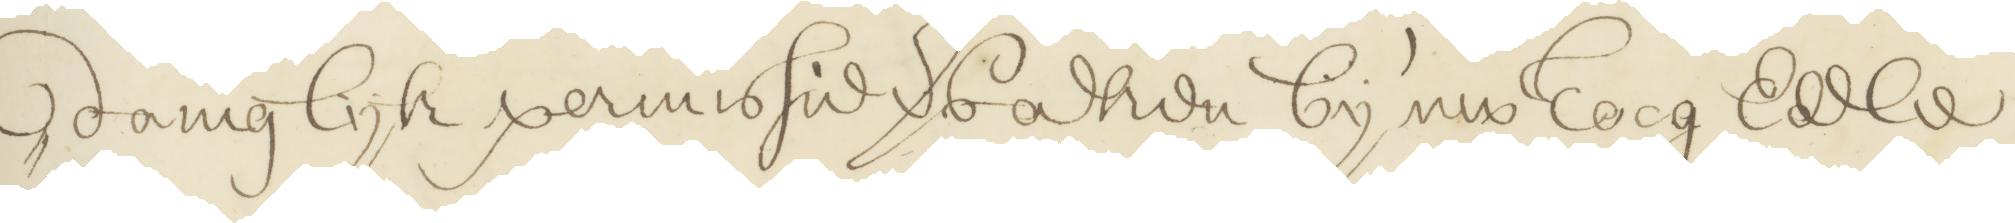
daniglijk permissie versoeken bij uw hoog Edele
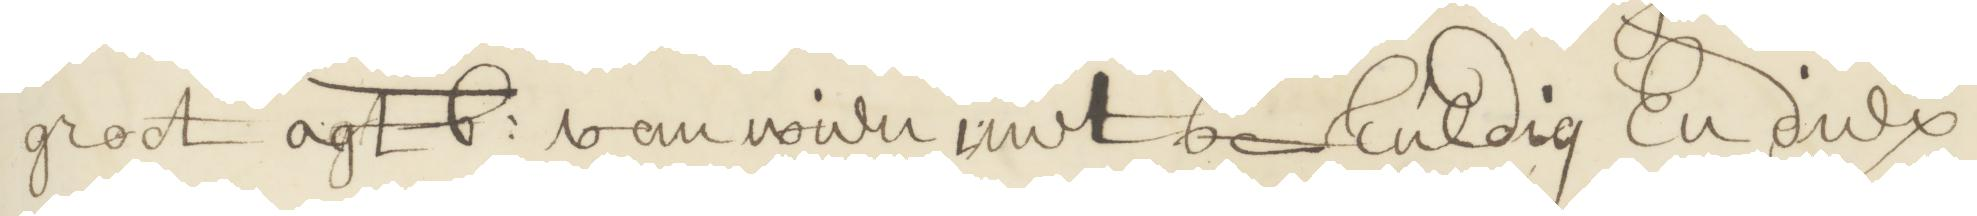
groot agtb: van wien met schuldig En diep
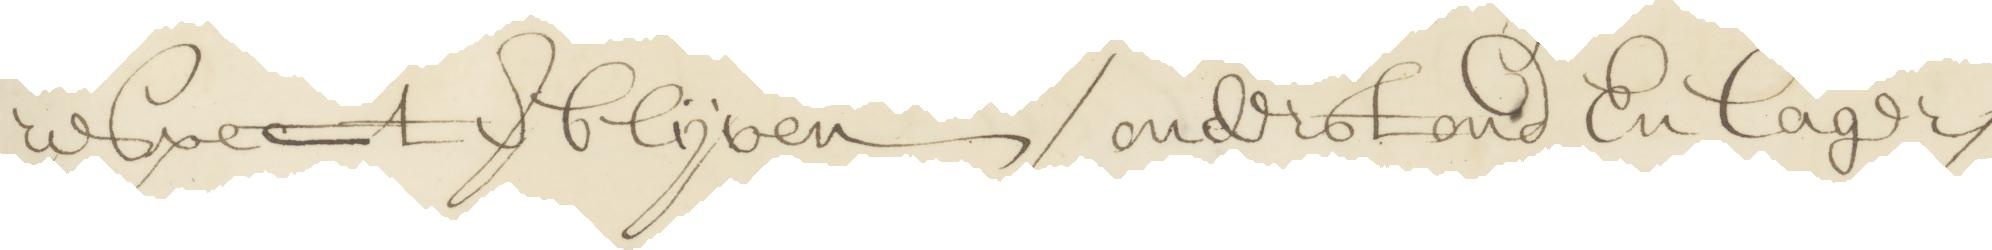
respect verblijven /onderstond En lager/
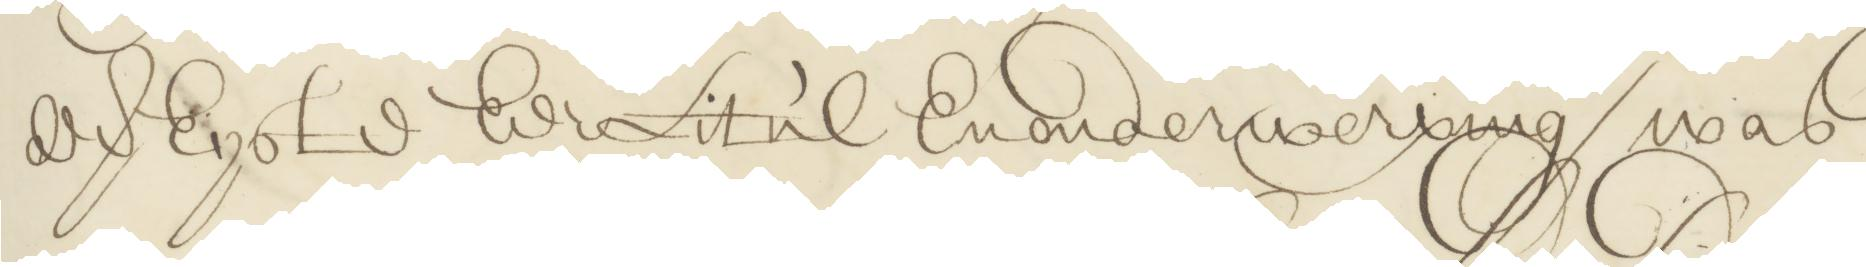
de vereijste Eer titul En onderwerping /was
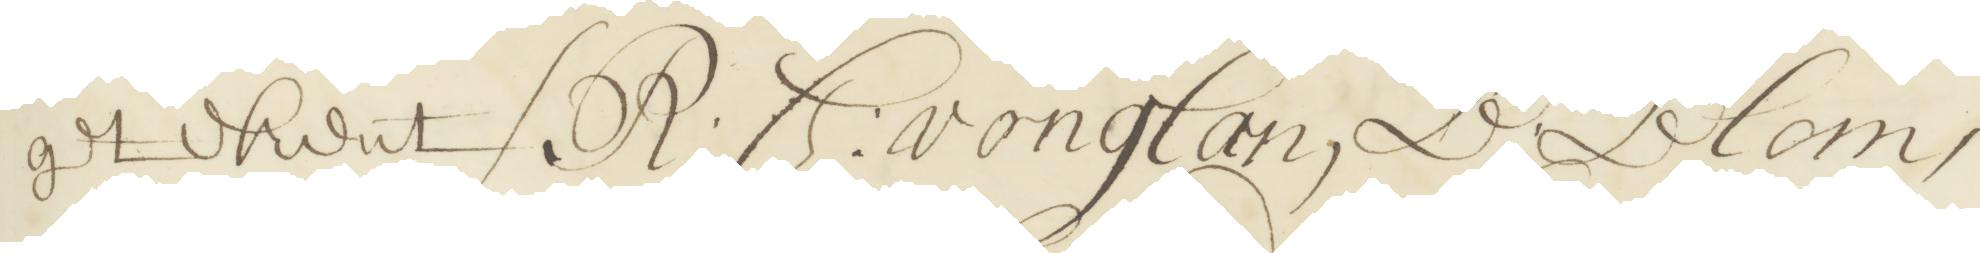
getekent/ R: C: vonglan, B: Blom,
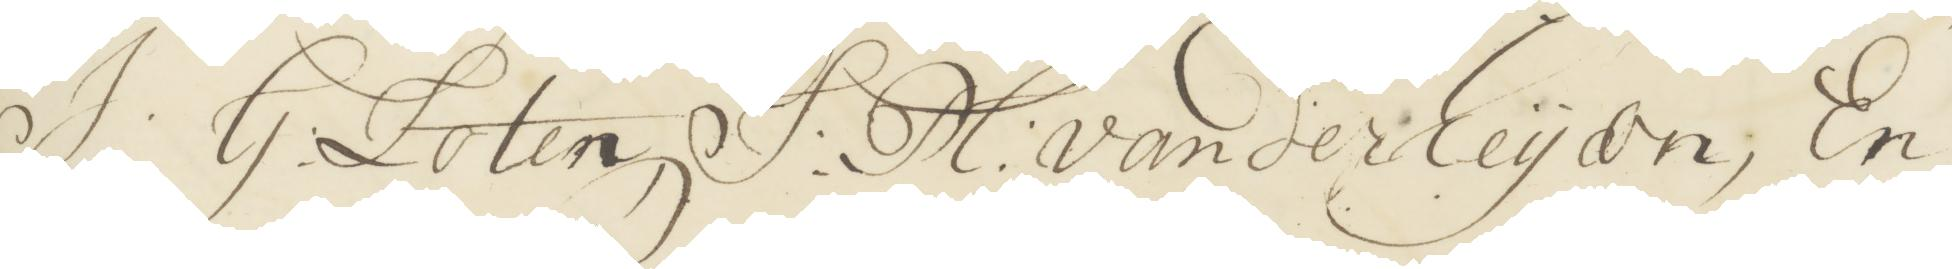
J: G: Loten, S: M: van der heijden, En
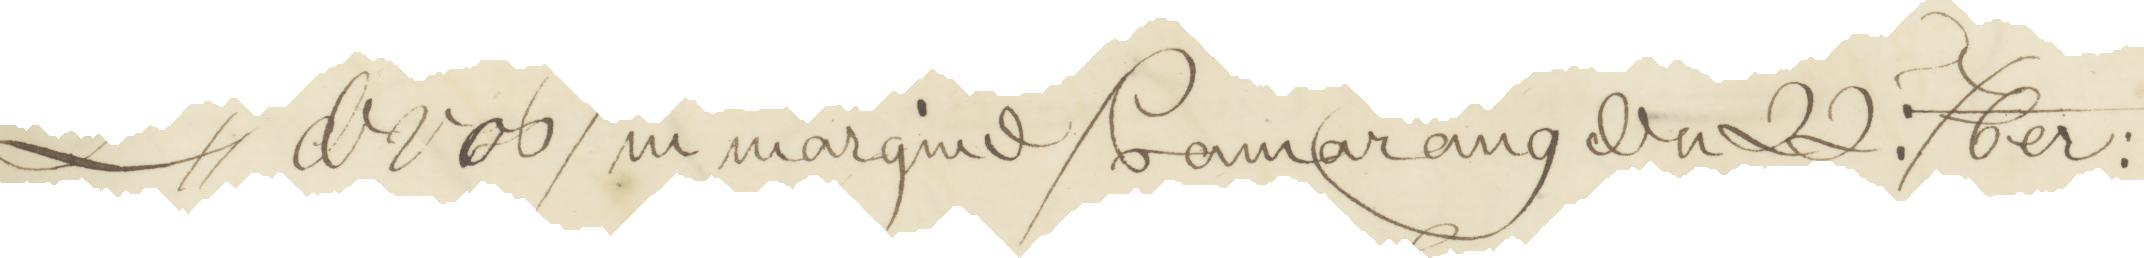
P„r devos /in margine/ samarang den 22:' 7ber:
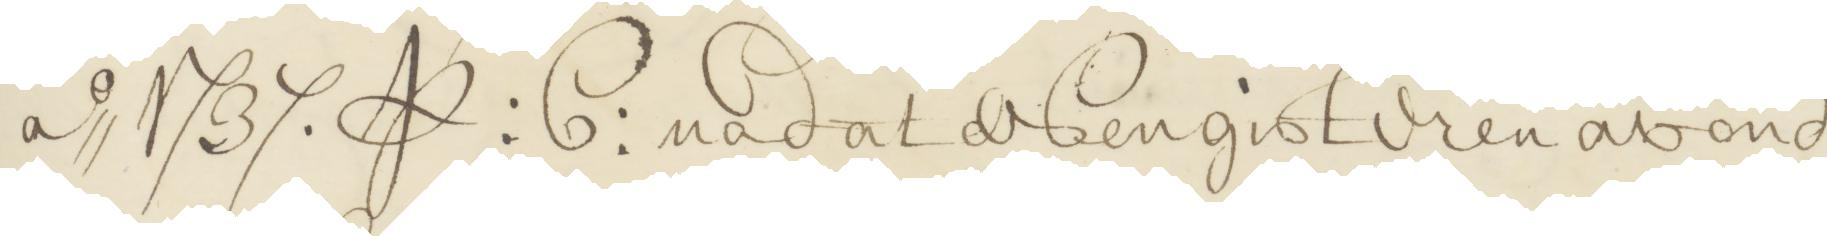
a„o 1737. p: s: na dat desen gisteren avond
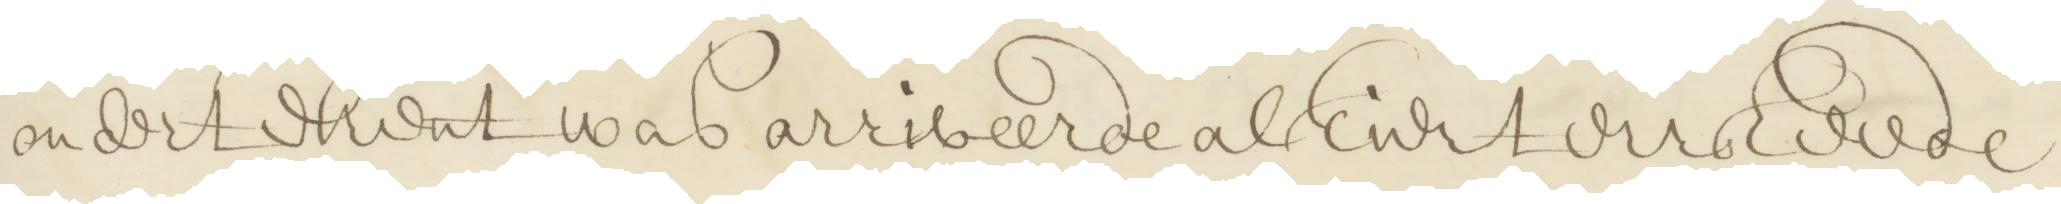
ondertekent was arriveerde alhier tersteede
